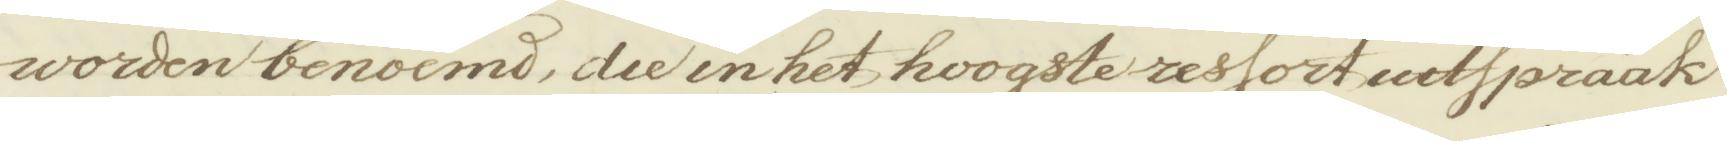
worden benoemd, die in het hoogste ressort uitspraak
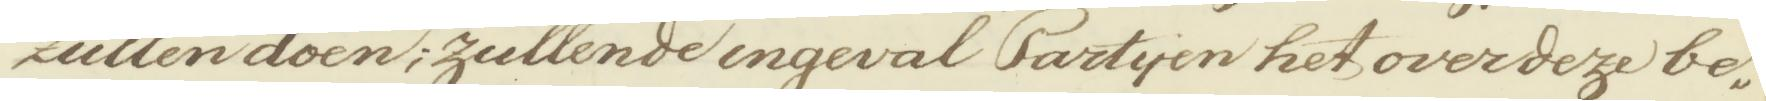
zullen doen; zullende ingeval Partyen het over deze be„
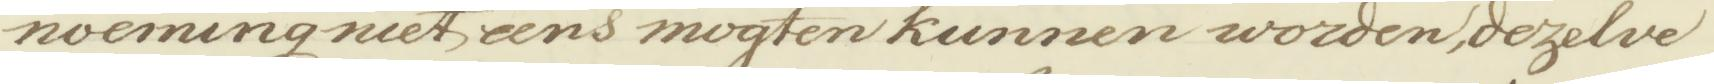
noeming niet eens mogten kunnen worden, dezelve
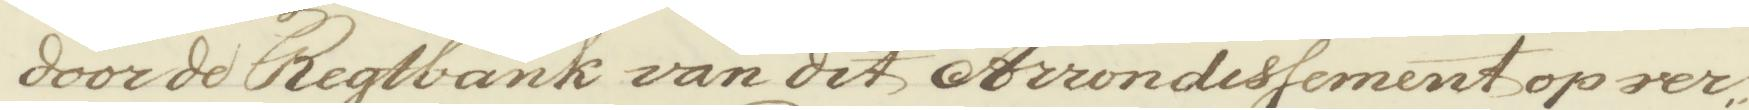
door de Regtbank van dit Arrondissement op ver„
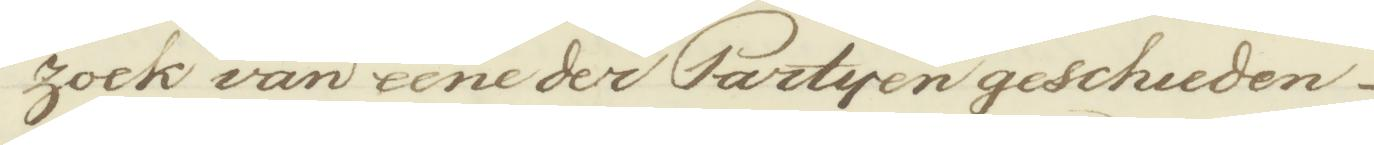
zoek van eene der Partyen geschieden
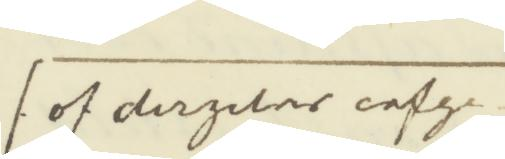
¶ of derzelves erfge
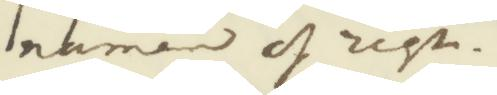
namen of regt-
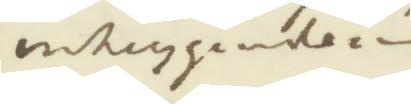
verkreygenden
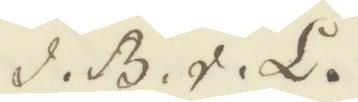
J. B. v. L.
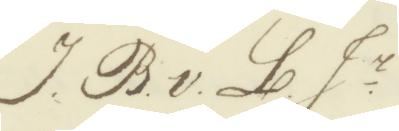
J: B: v: L J:r
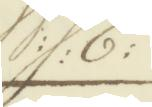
W:J.E:
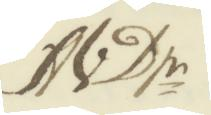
AVD j:r
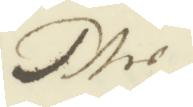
PMj:r
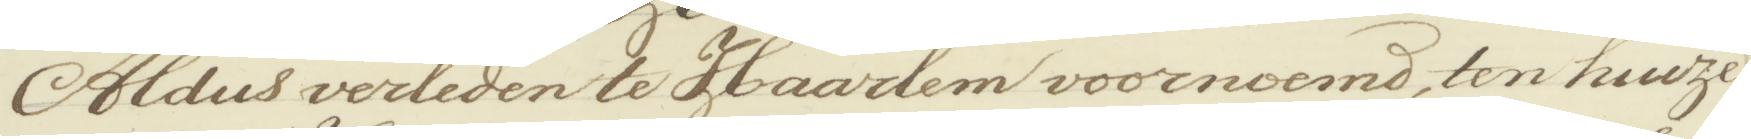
Aldus verleden te Haarlem voornoemd, ten huize
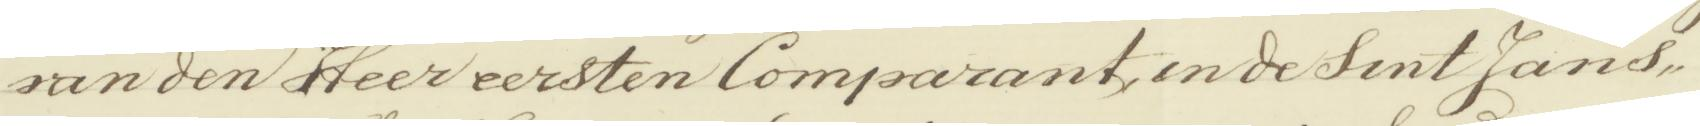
van den Heer eersten Comparant, in de Sint Jans„
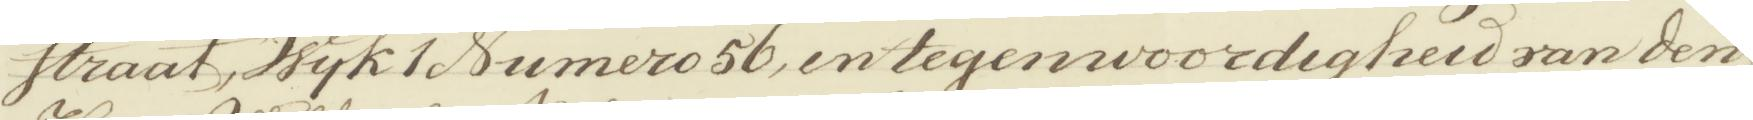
straat, Wyk 1 Numero 56, in tegenwoordigheid van den
